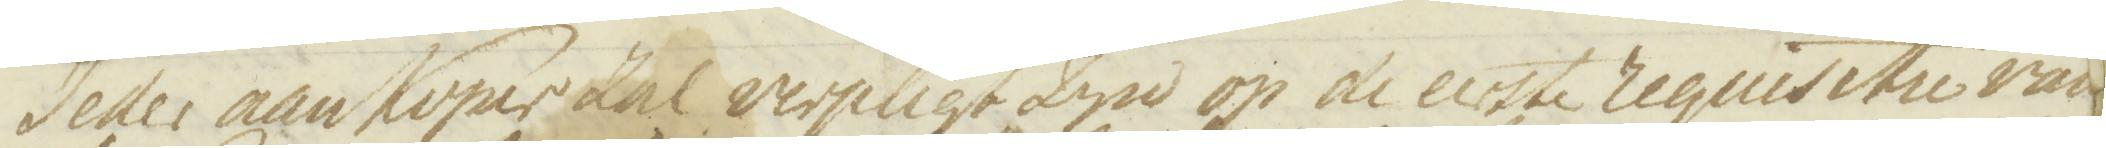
Ieder aan koper Zal verpligt Zyn op de eerste Requisitie van
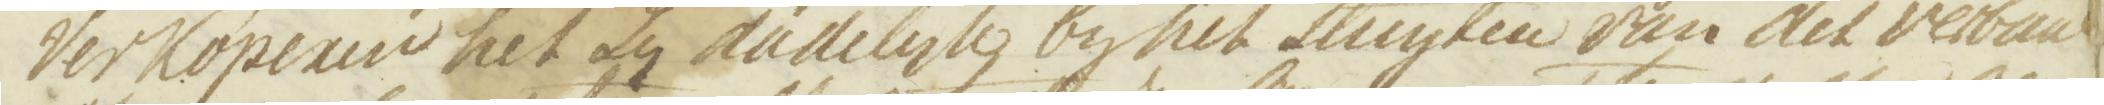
Verkoperen het Zy dadelyk by het sluyten van dit verbaa
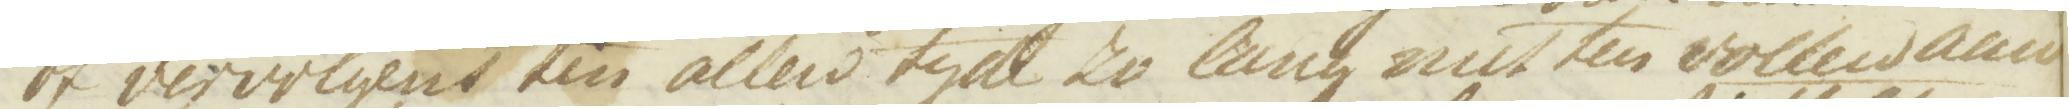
of vervolgens ten allen tyde zo lang niet ten vollen aan
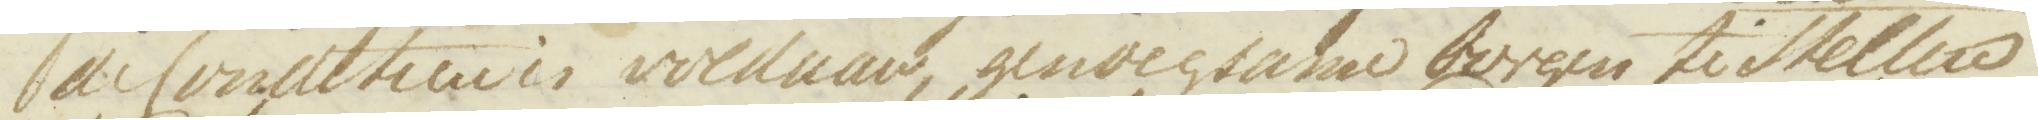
de Conditien is voldaan, genoegsame borgen te stellen
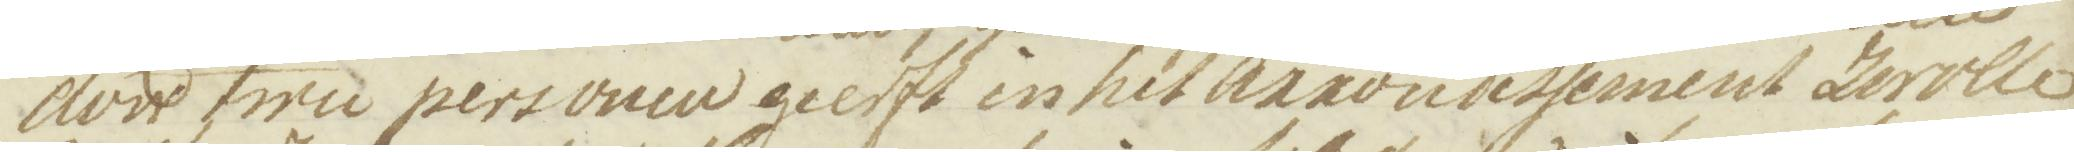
door twee personen geerft in het Arrondissement Zwolle
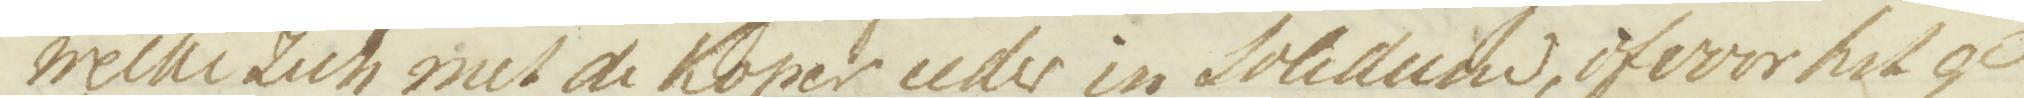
welke Zich met de Koper ieder in Solidum, of voor het ge
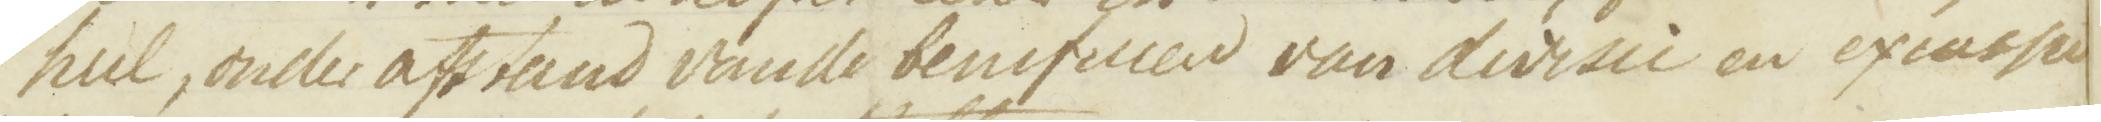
heel, onder afstand van de benificien van divisie en excussie
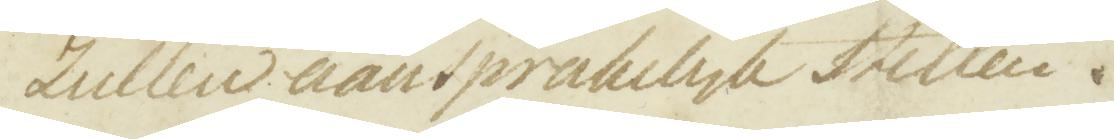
Zullen aansprakelyk stellen.
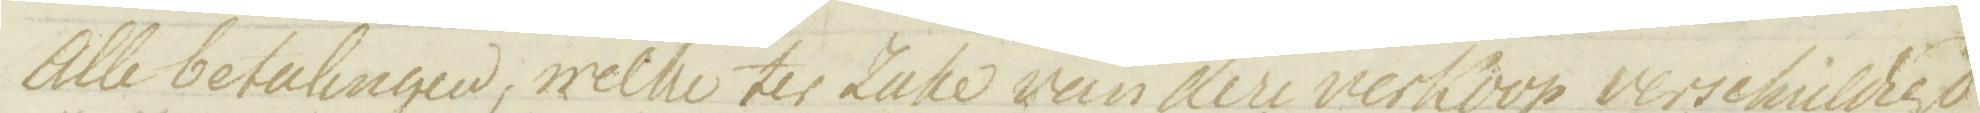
Alle betalingen, welke ter Zake van deze verkoop verschuldigd
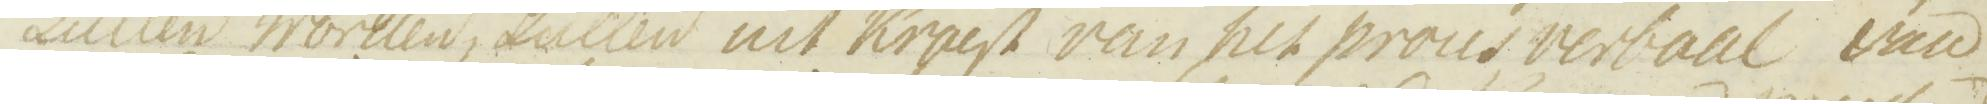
Zullen worden, Zullen uit kragt van het proces verbaal van
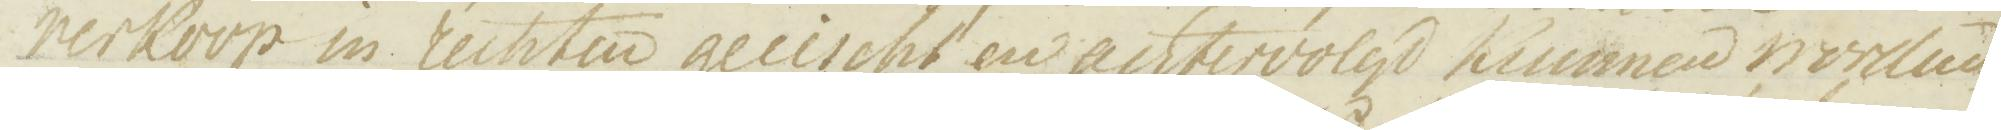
verkoop in rechten geeischt en achtervolgd Kunnen worden
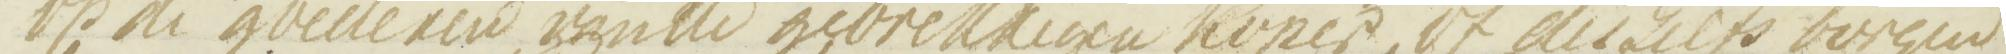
op de goederen van de gebrekkigen koper, of detzelfs borgen
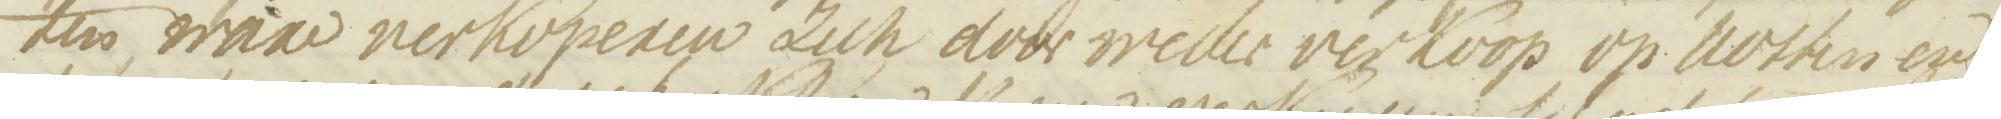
ten ware verkoperen Zich door weder verkoop, op kosten en
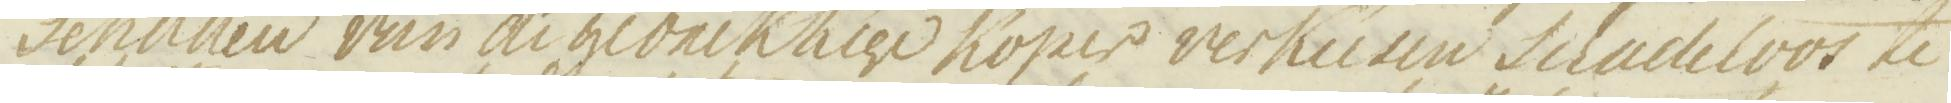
Schaden van de gebrekkige Koper verkiezen Schadeloos te
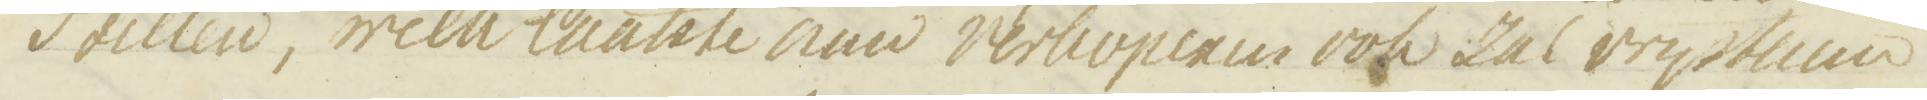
Stellen, welk laatste aan verkoperen ook Zal vrystaan
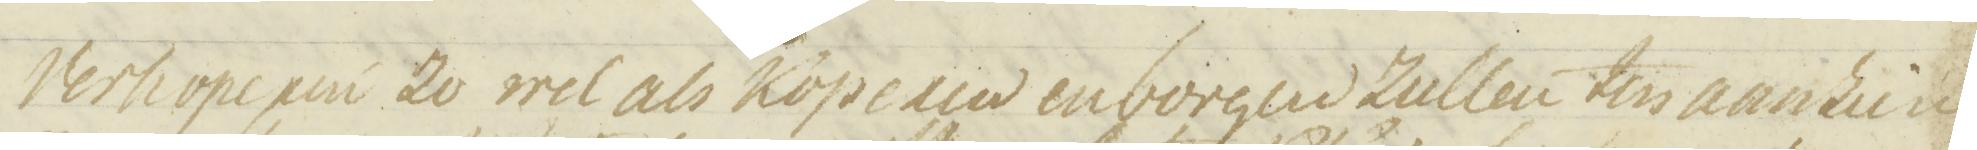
Verkoperen Zo wel als koperen en borgen Zullen ten aanzien
